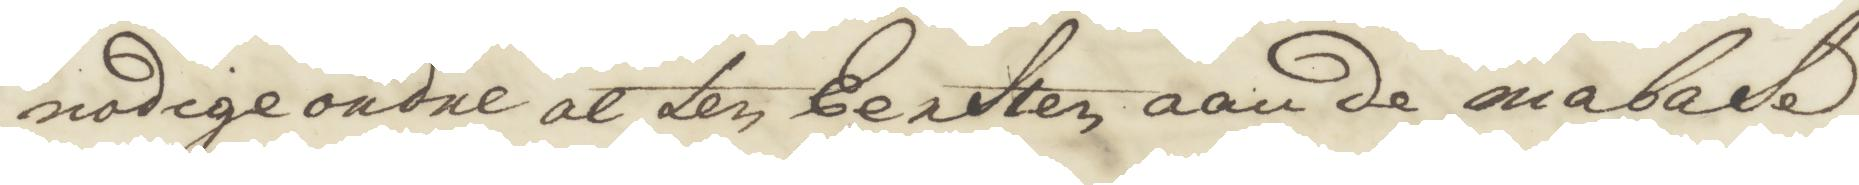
nodige ordre al ten Eersten aan de mabase
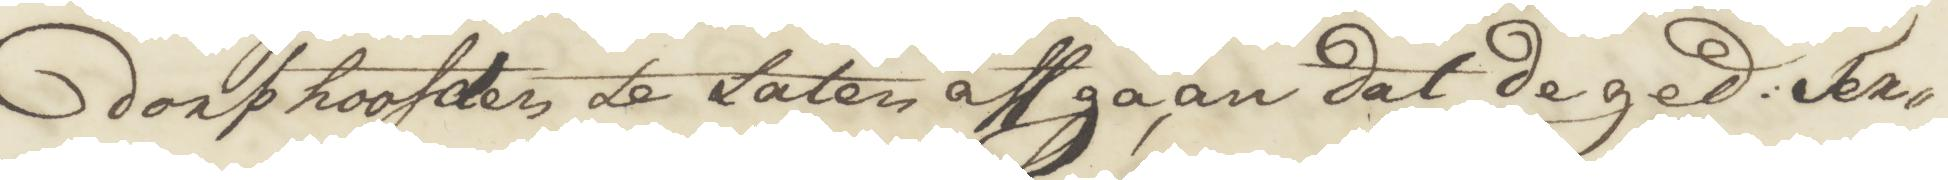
dorphoofden te laten affgaan dat de ged: Ter„
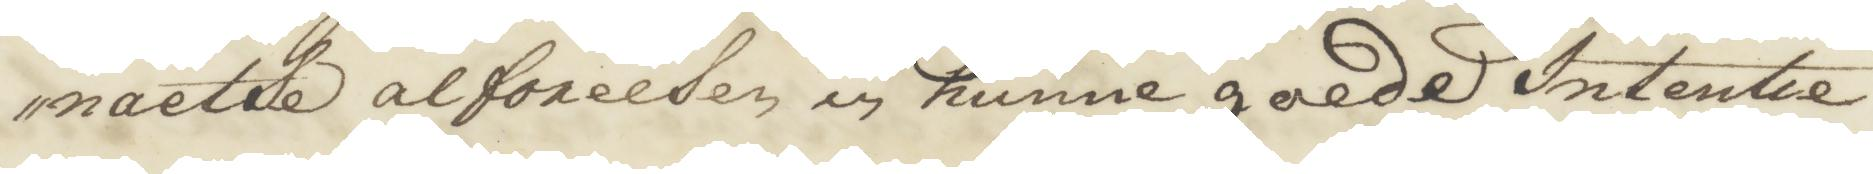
„naetse alforeesen in hunne goede Intentie
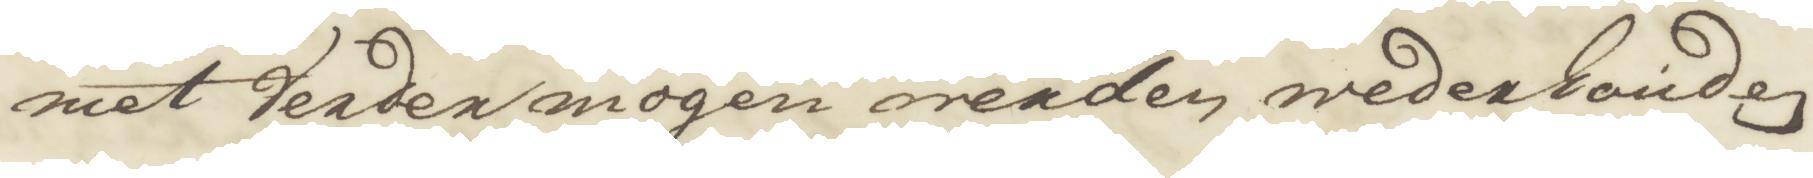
niet verder mogen werden wederhouden
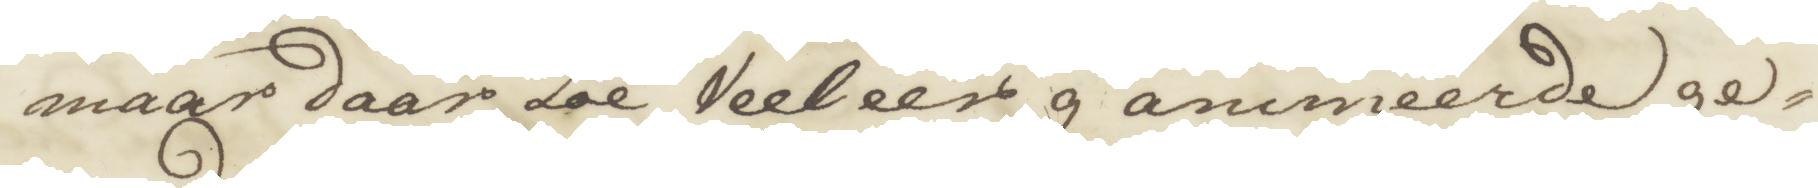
maar daar toe veel eer g’animeerde ge=
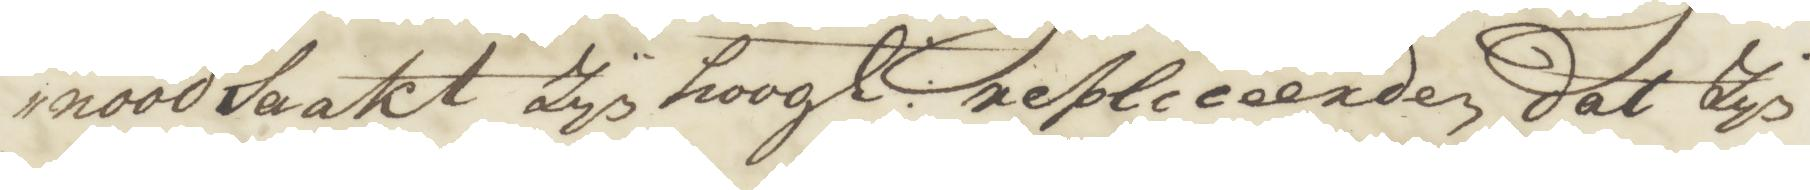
„noodsaakt zijn hoogh:t repliceerden dat zijn
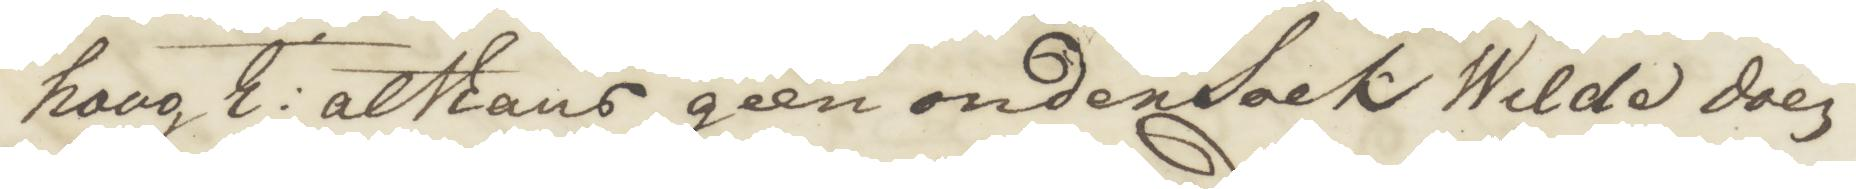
hoogh:t althans geen ondersoek wilde doen
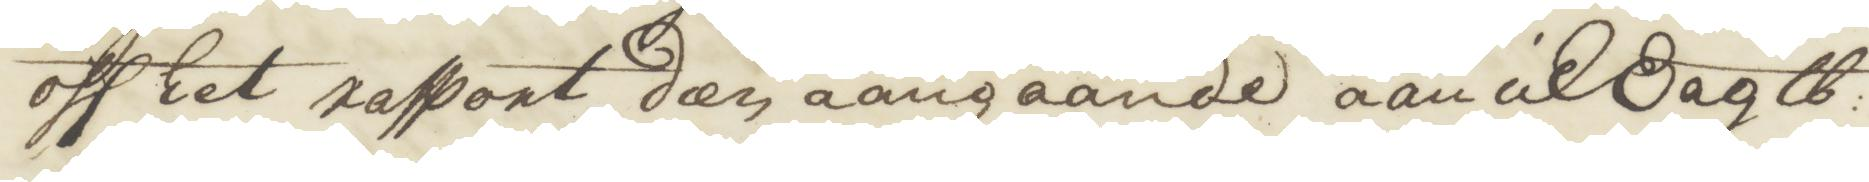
off het rapport dien aangaande aan uEE agtb:
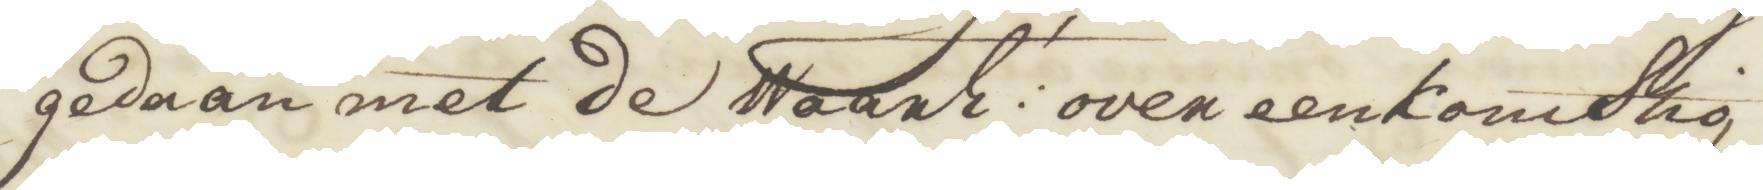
gedaan met de waarh:t over eenkomstig
